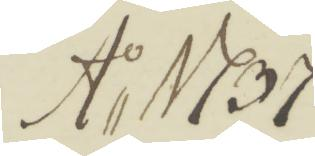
A„o 1737
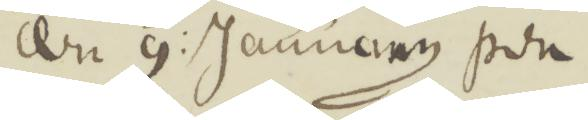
den 9:' Januarij per
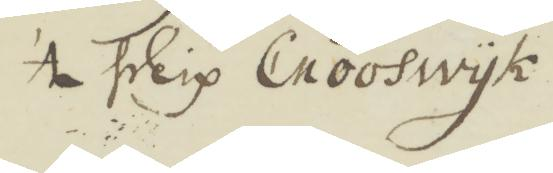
’t schip Crooswijk
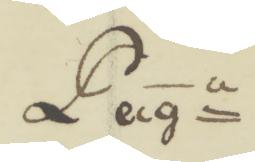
Pag=a
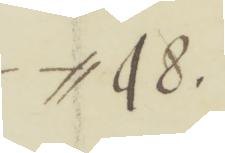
–„48.
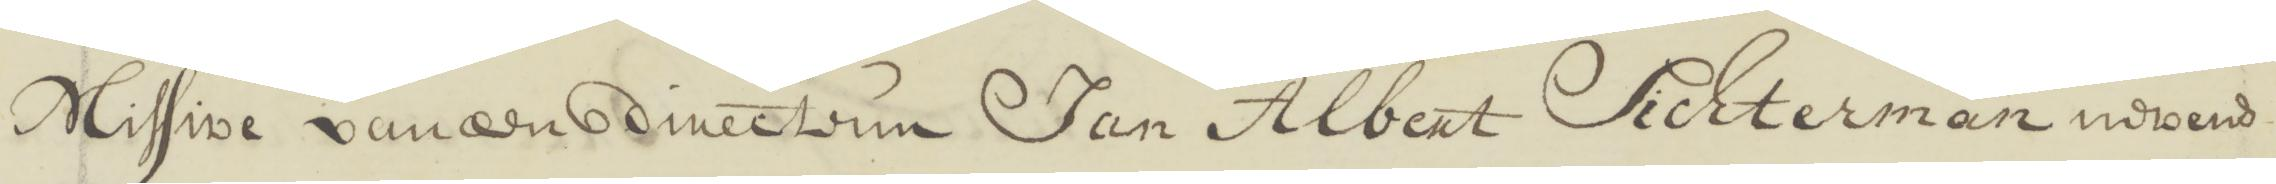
Missive van den directeur Ian Albert Sichterman nevens
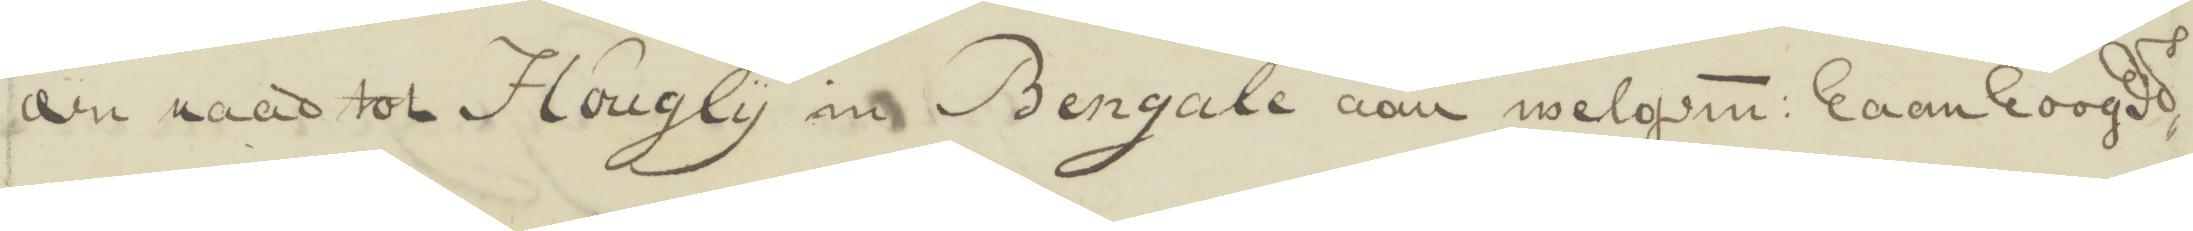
den raad tot Houglij in Bengale aan welgem: haar hoogEd„s
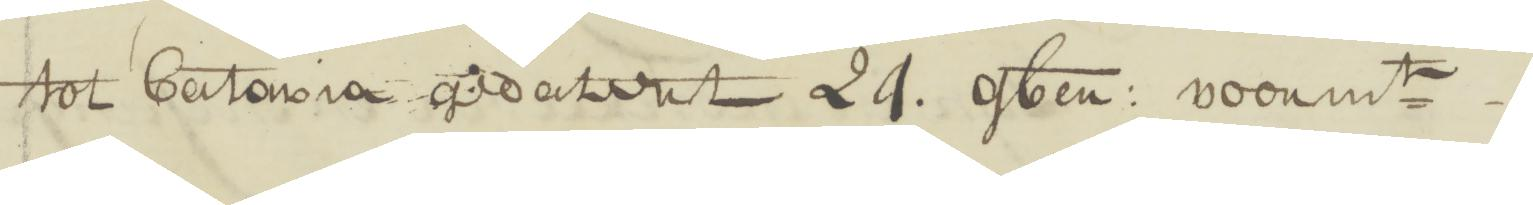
tot batavia gedateert 24. 9ber: voorm=t –
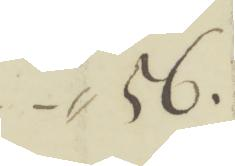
– „56.
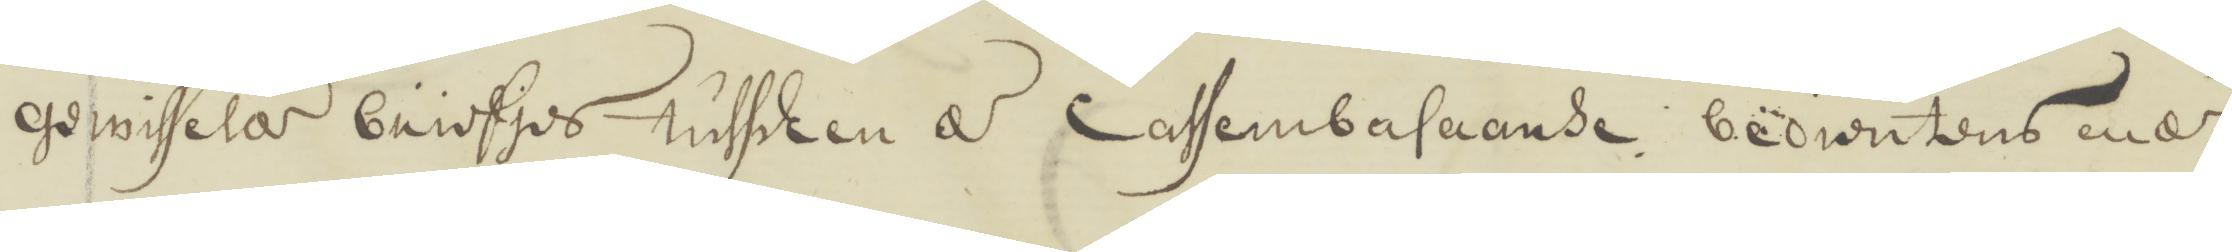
gewisselde briefjes tusschen de Cassembasaarse bedientens ende
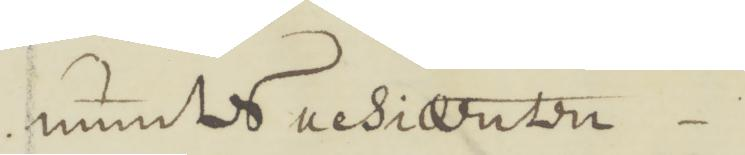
munts residenten –
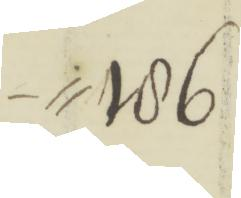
– „186:
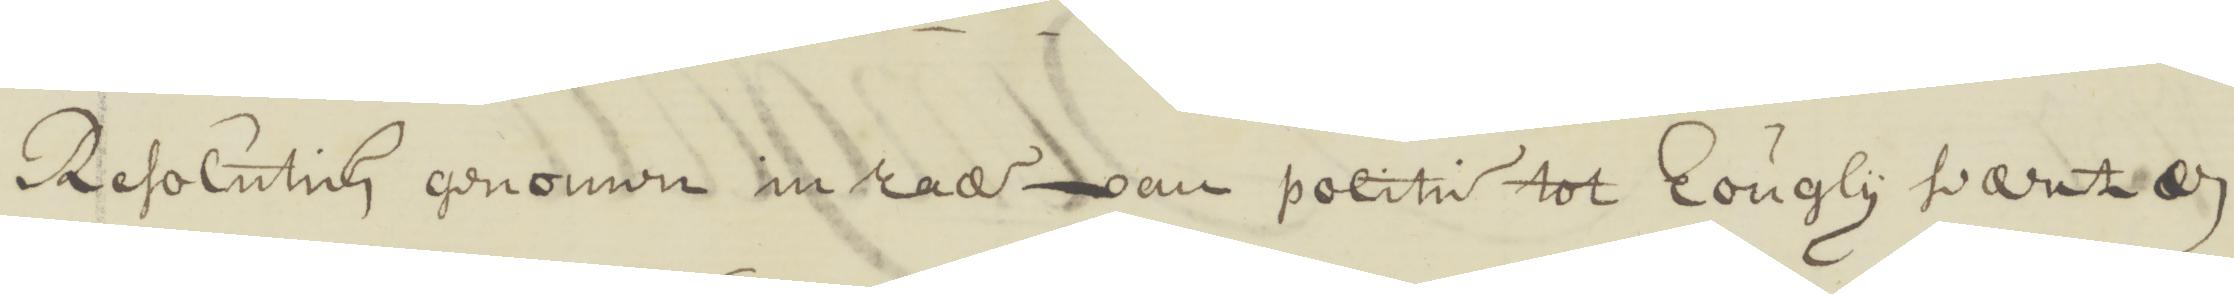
Resolutien genomen in rade van politie tot houglij sedert den
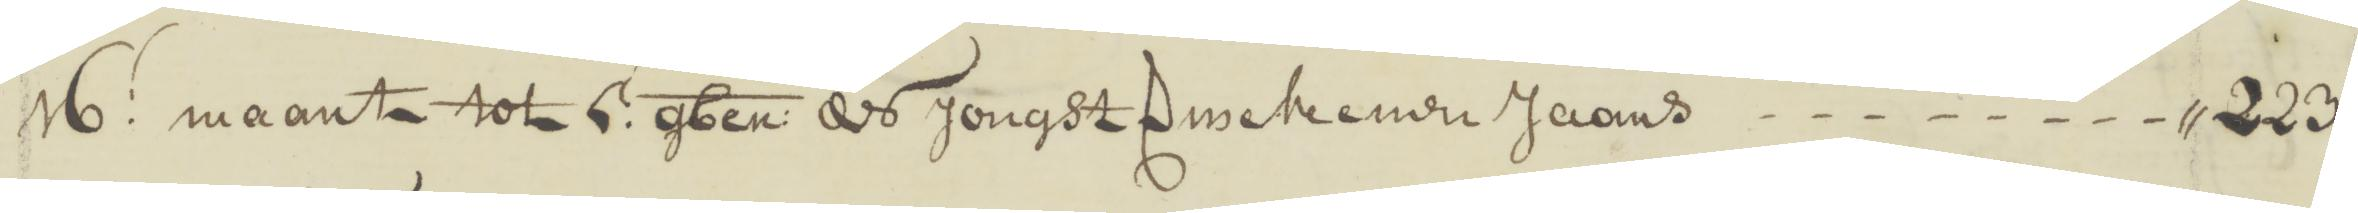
16:' maart tot 5.' 9ber: des jongst verwekenen Jaars – – – – – – – – „ 223
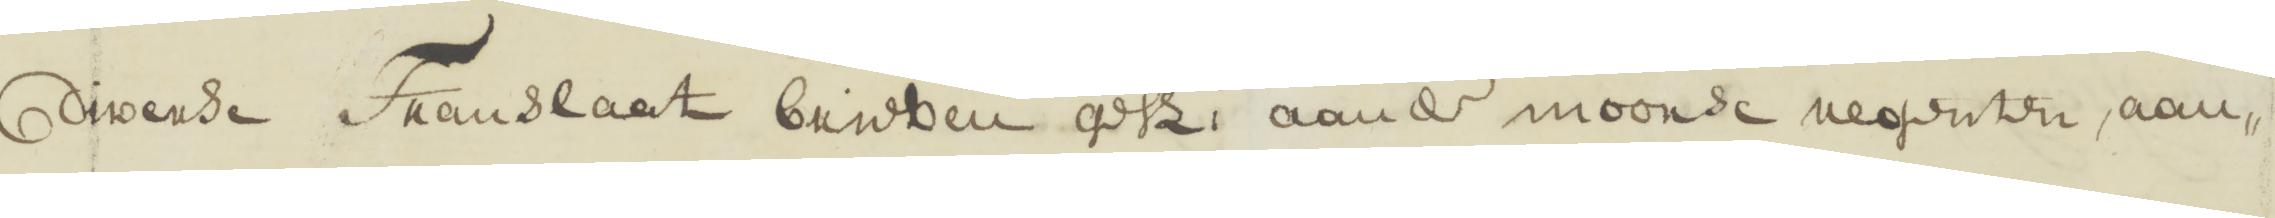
diverse Translaat brieven gesz: aan de moorse regenten, aan„
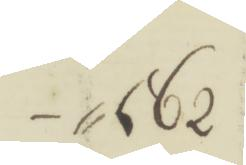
– „562
